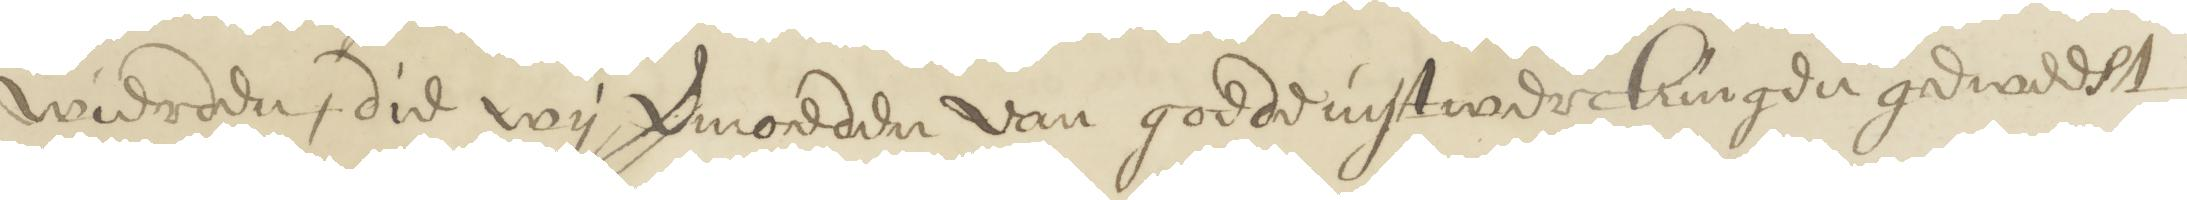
wierden, die wij vermoeden van goede uytwerckingen geweest
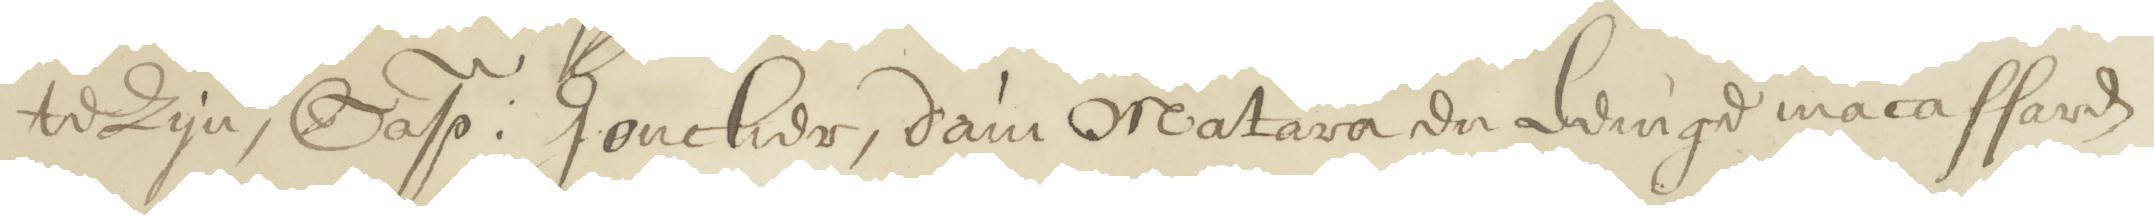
te zijn, Cap:n Joncker, dain Matara en Eenige macassaren
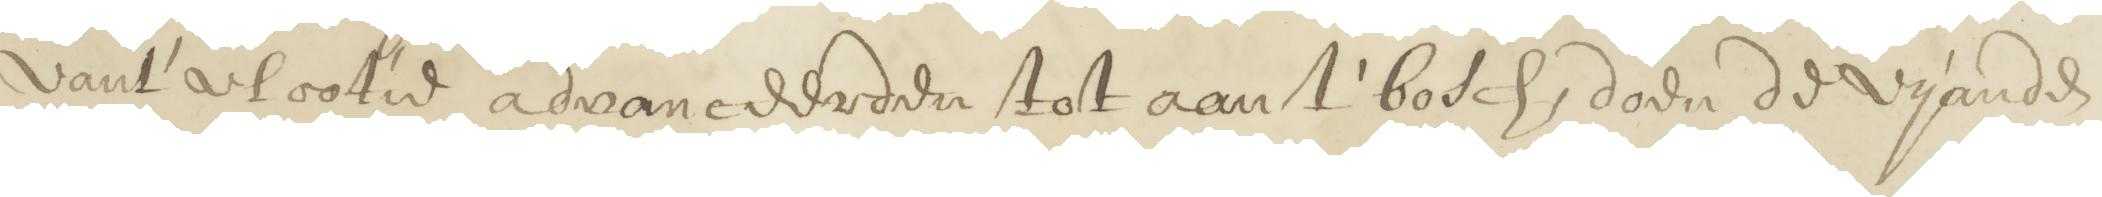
van t' vlootie advanceerden tot aan t' bosch, doen de vijanden
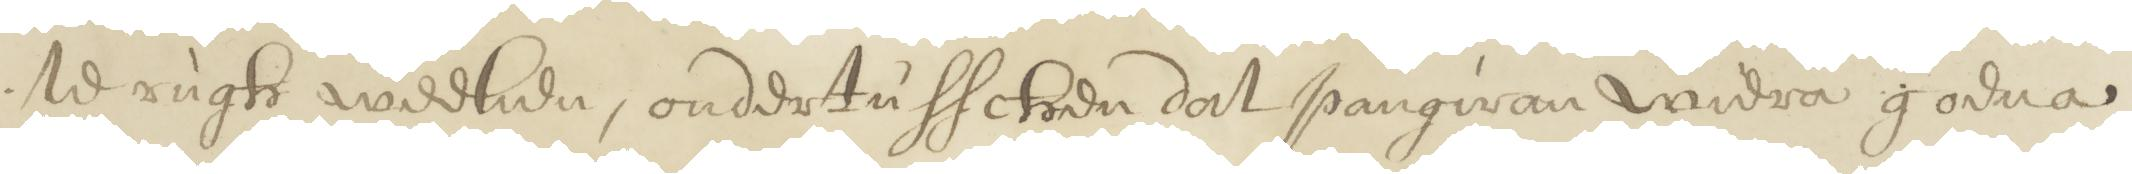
te rugh weeken, ondertusschen dat pangiran wiera goena
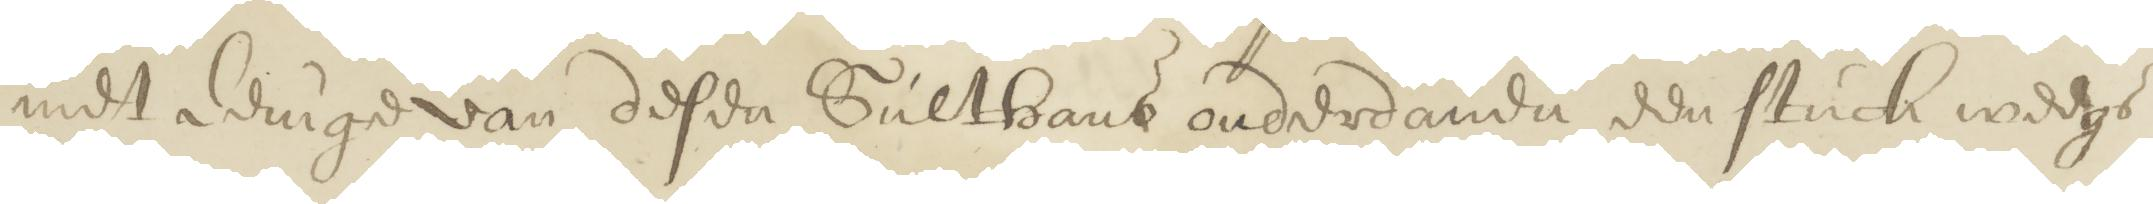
met Eenige van desen Sulthans onderdanen een stuck weegs
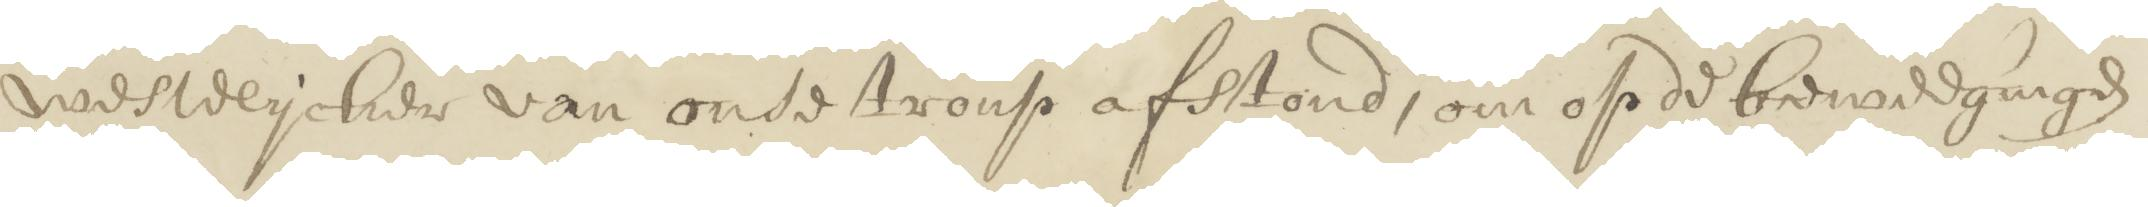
westelijcker van onse troup afstond, om op de beweegingen
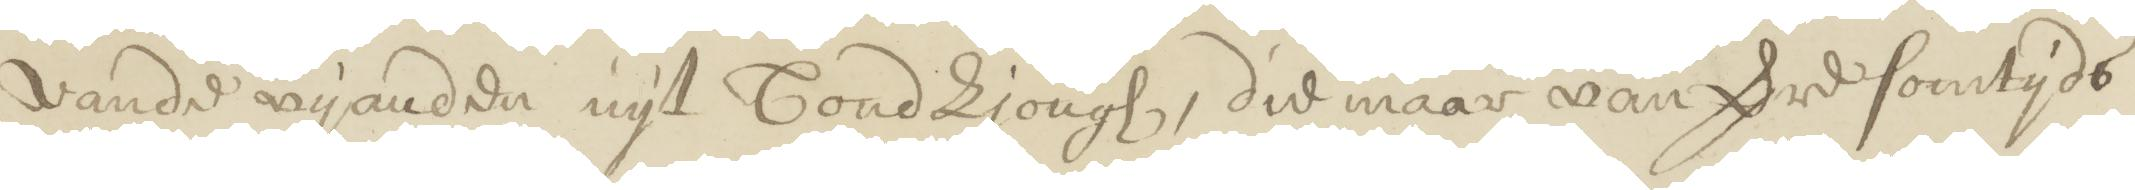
van de vijanden uijt Tondzjongh, die maar van verre somtijds
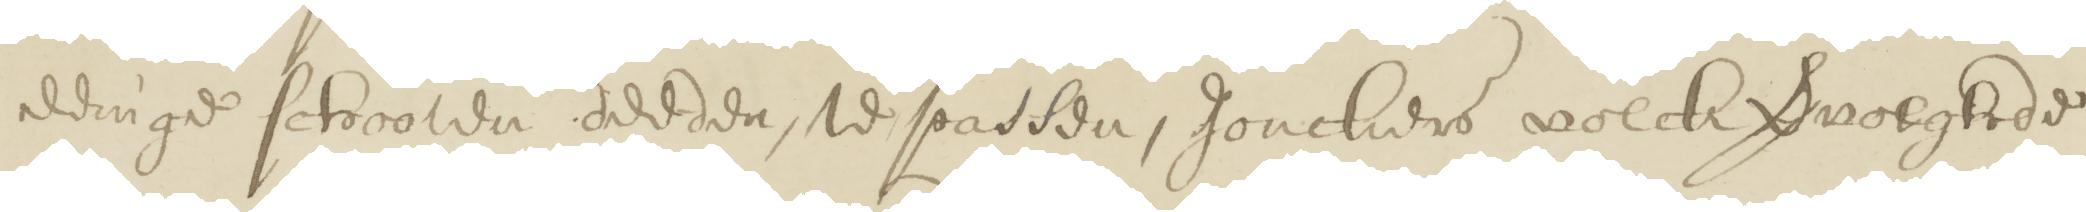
eenige schooten deeden, te passen, jonckers volck vervolghde
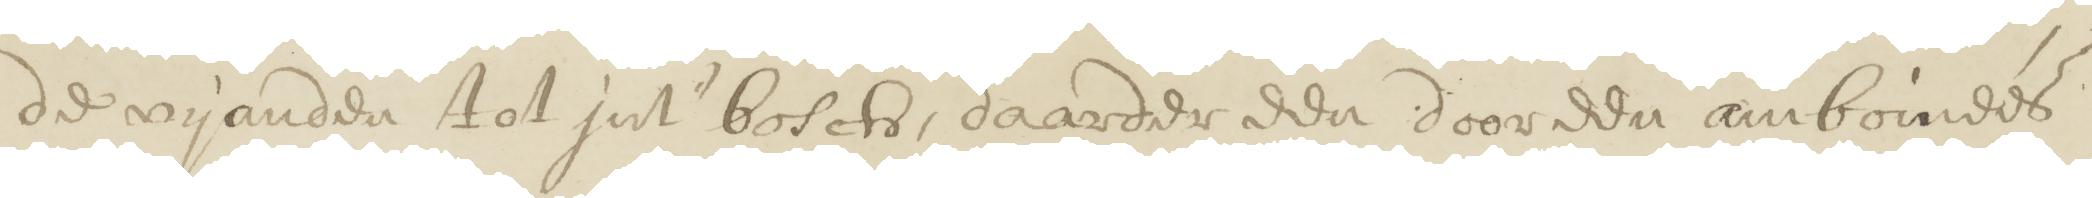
de vijanden tot int' bosch, daarder een door een amboineés
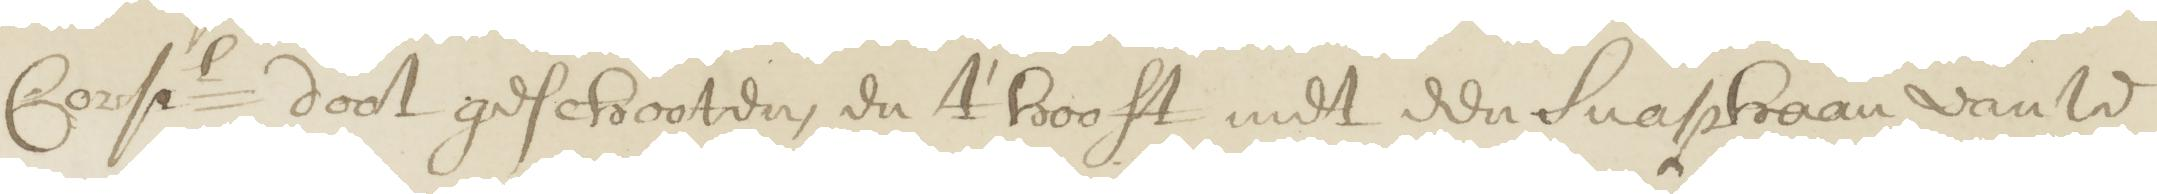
Corp=l doot geschooten, en t' hooft met een snaphaan van te
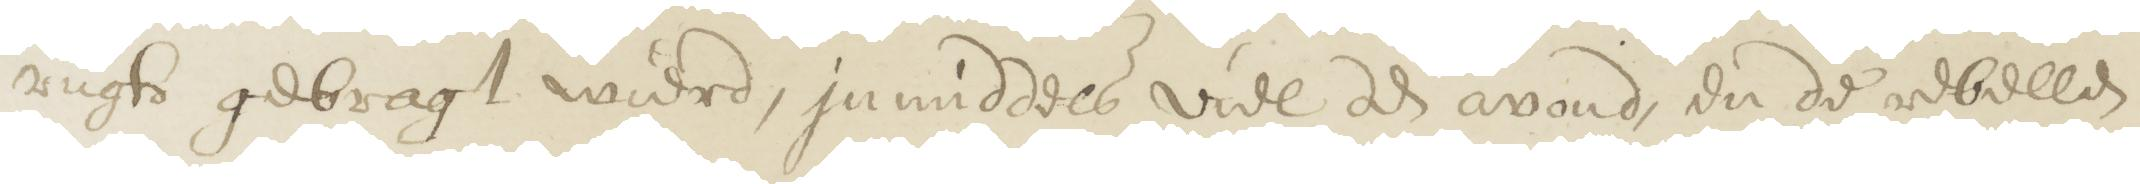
rugh gebragt wierd, inmiddels viel den avond, en de rebellen
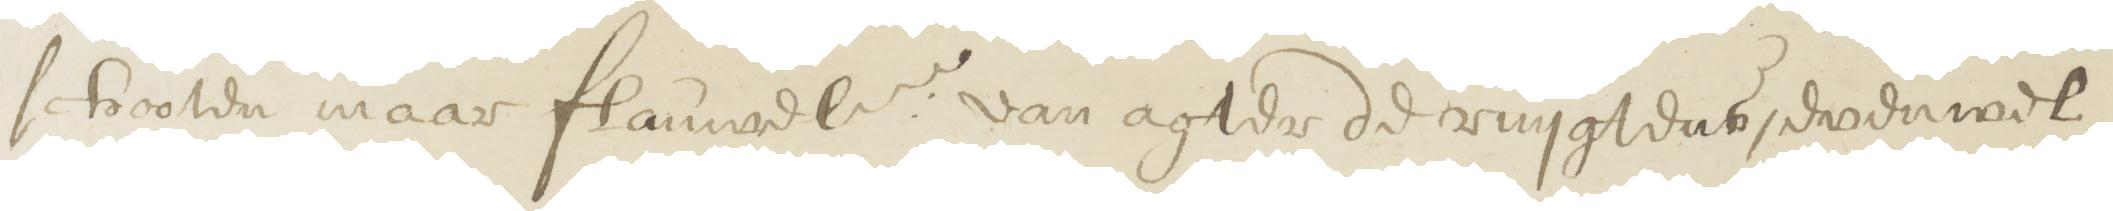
schooten waar flauwel: van agter de ruijgtens, even wel
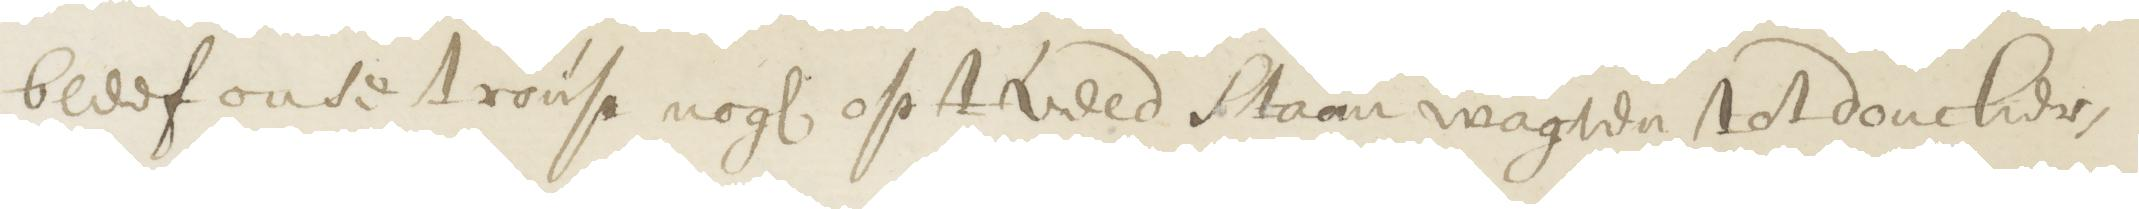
bleef onse trous nogh op t' veld staan wagten tot doncker,
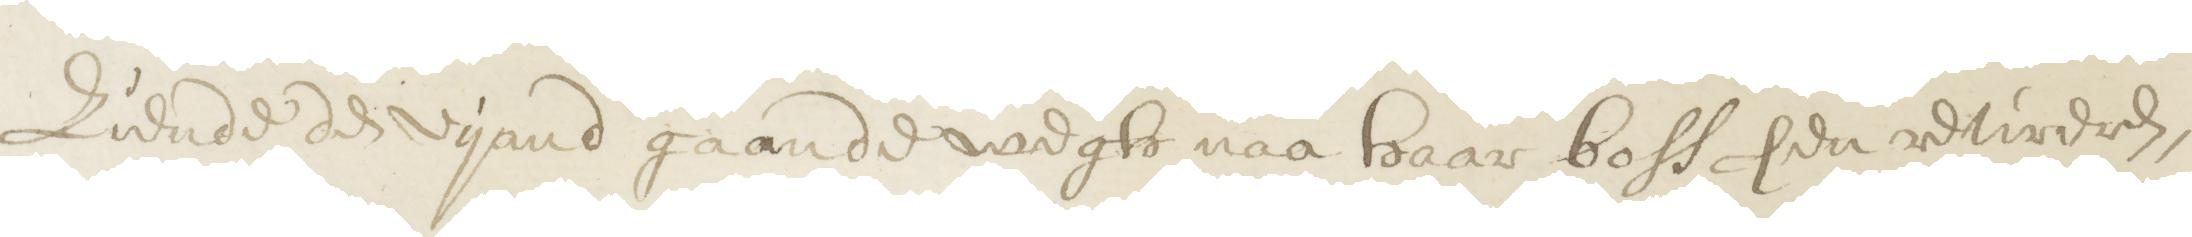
ziende den vijand gaande wegh naa haar bosschen retireren,
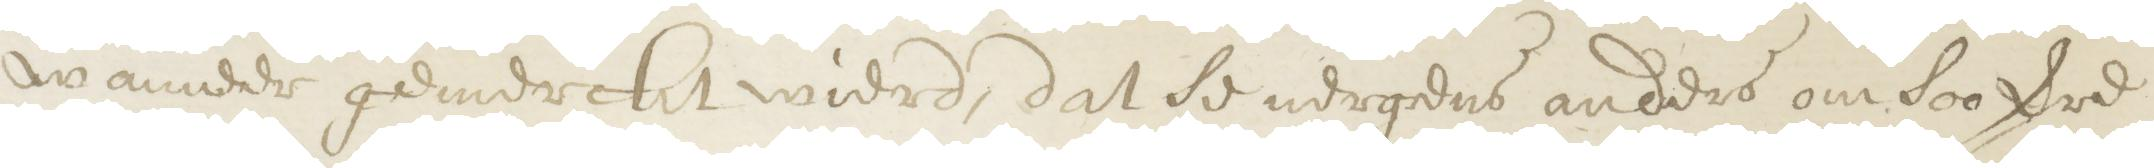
wanneer gemerckt wierd, dat se nergens anders om soo verre
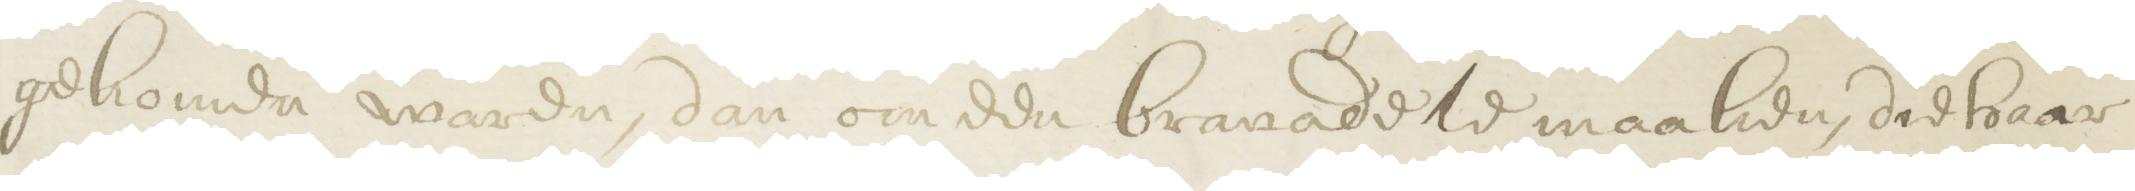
gekomen waren, dan om een bravade te maaken, die haar
